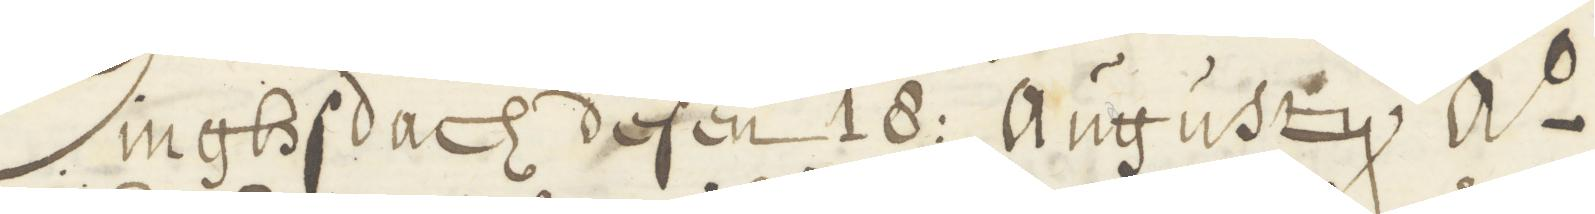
Dinghsdach desen 18:en Augustij A-o
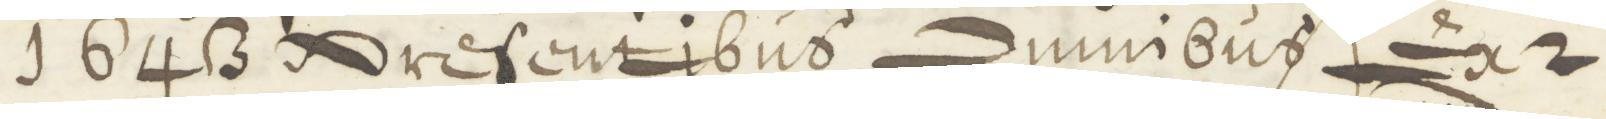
1643 presentibus Omnibus Ex
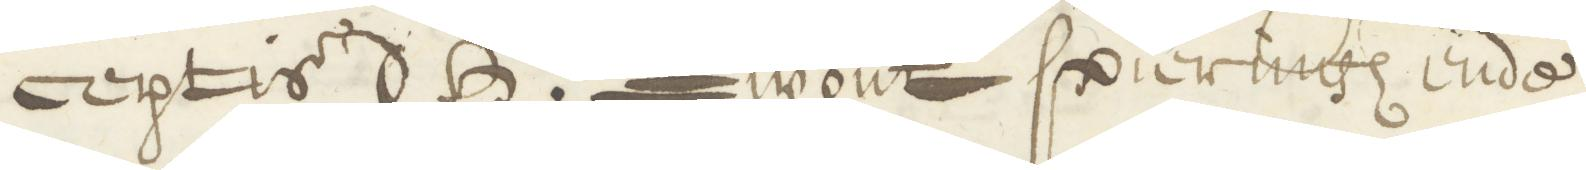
ceptis d H.ren Ewout spierangh ende
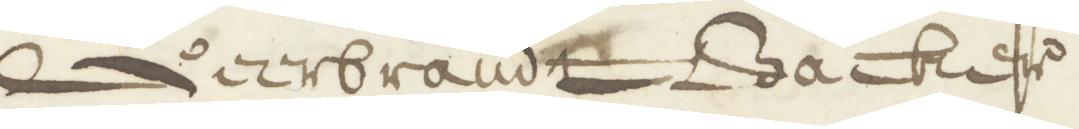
Geerbrandt Backer
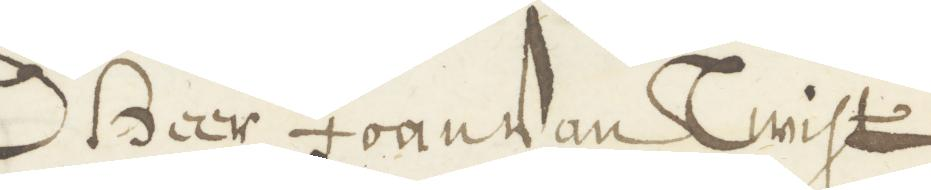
D Heer Ioan van Twist
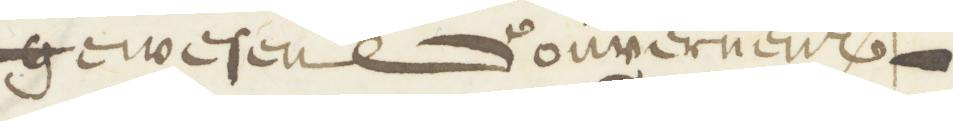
gewesen Gouverneur —
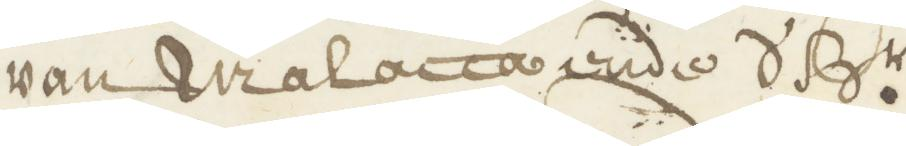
van malacca ende d’ H.r
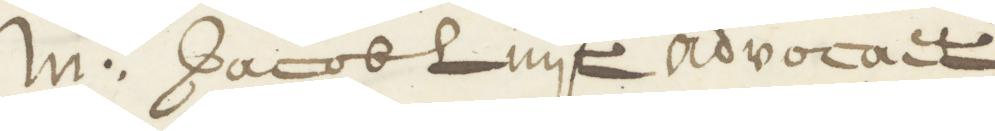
M;r Jacob Luijt advocaet
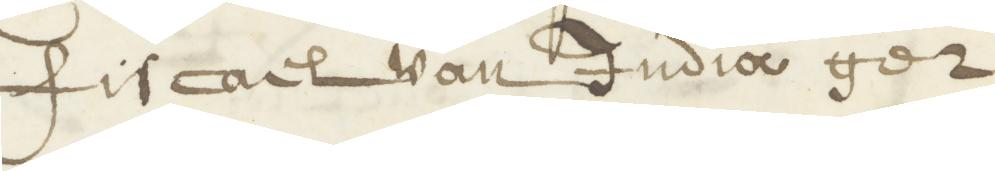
fiscael van India ge
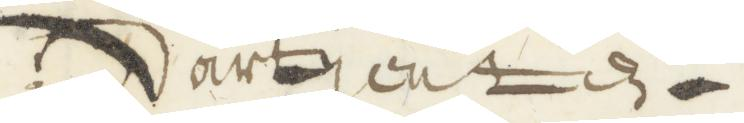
Partijenten —
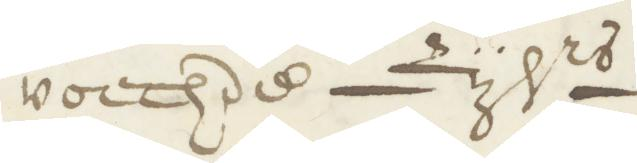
voechde Eijs—rs
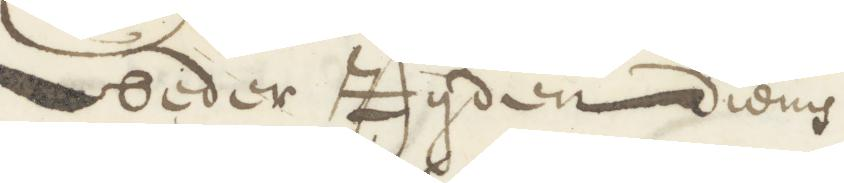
weder zyden dienen
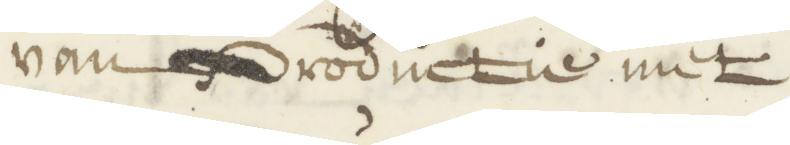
van productie met
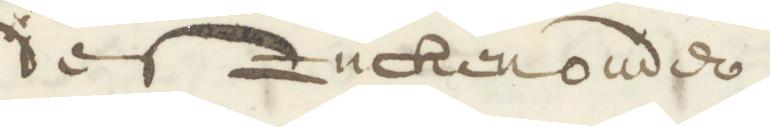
de stucken onder
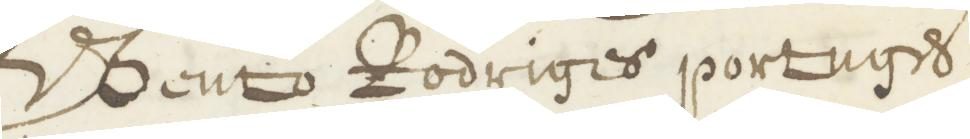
Wento Rodriges portuges
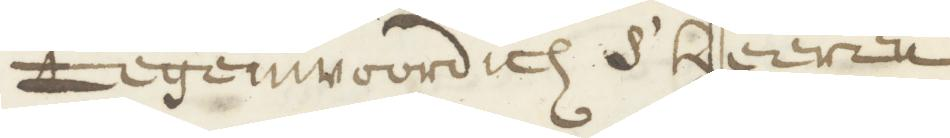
tegenwoordich s Heeren
